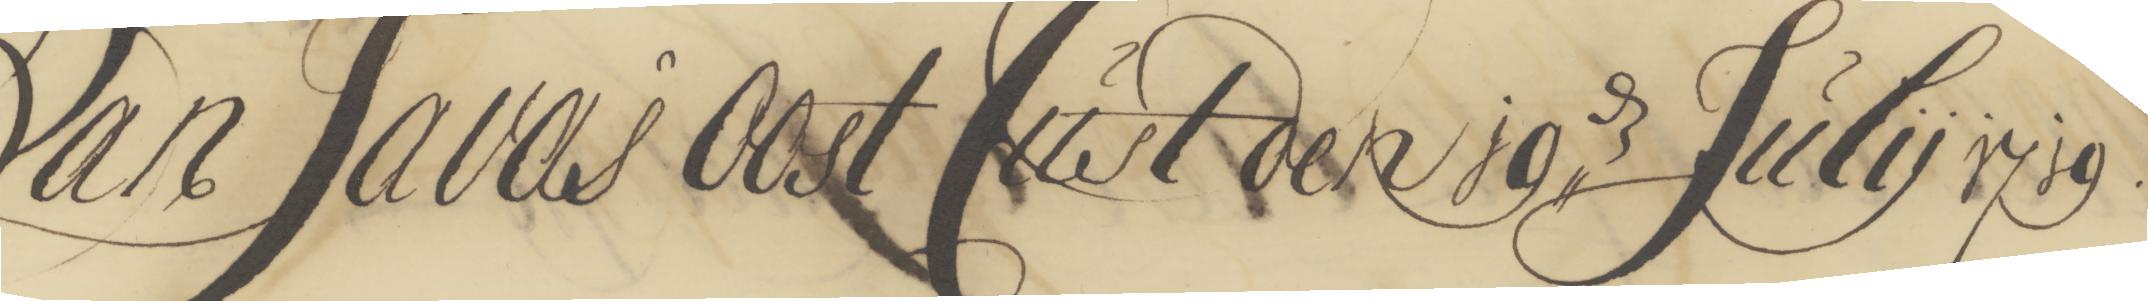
Van Java's Oost Cust den 19„en Julij 1719. —
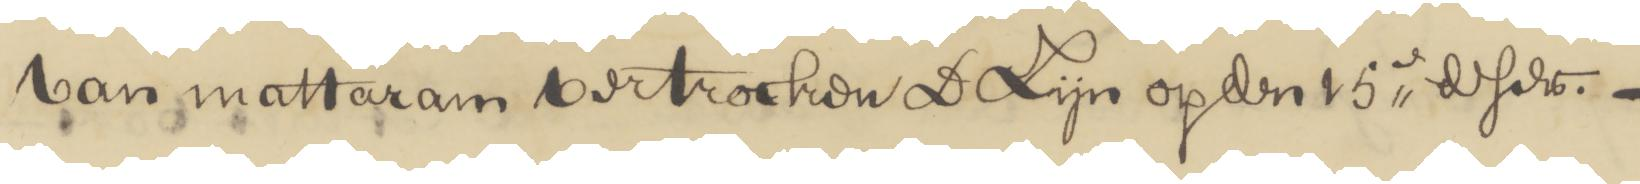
van mattaram vertrocken te zijn op den 15„e deser. -
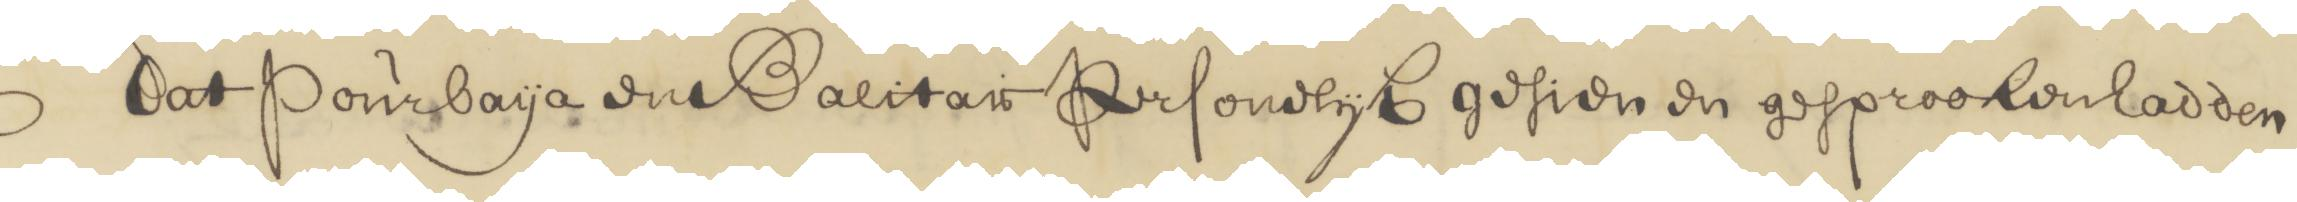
dat Pourbaija en Balitar Personelijk gesien en gesprooken hadden
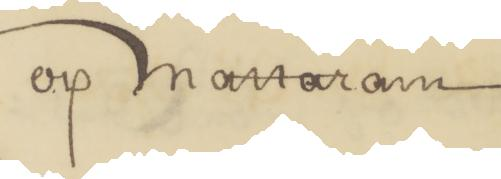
op Mattaram.
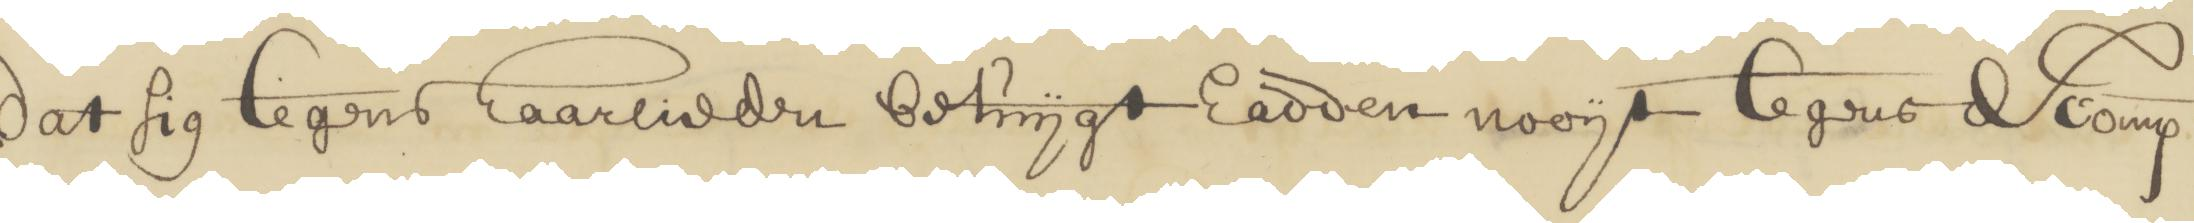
dat sig tegens haarlieden betuijgt hadden nooijt tegens d'Ecomp:
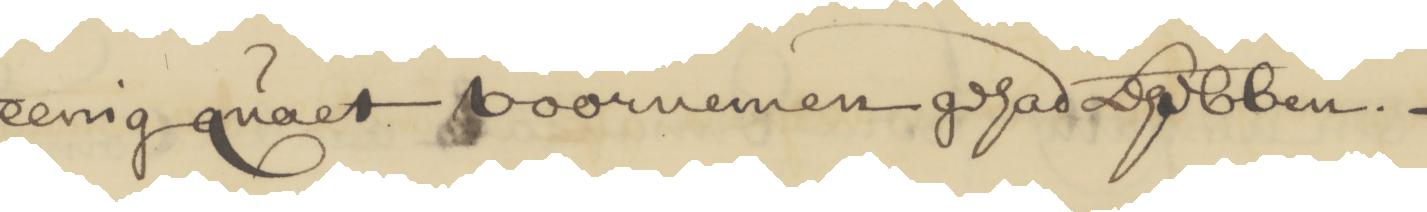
eenig quaet voornemen gehad tehebben.
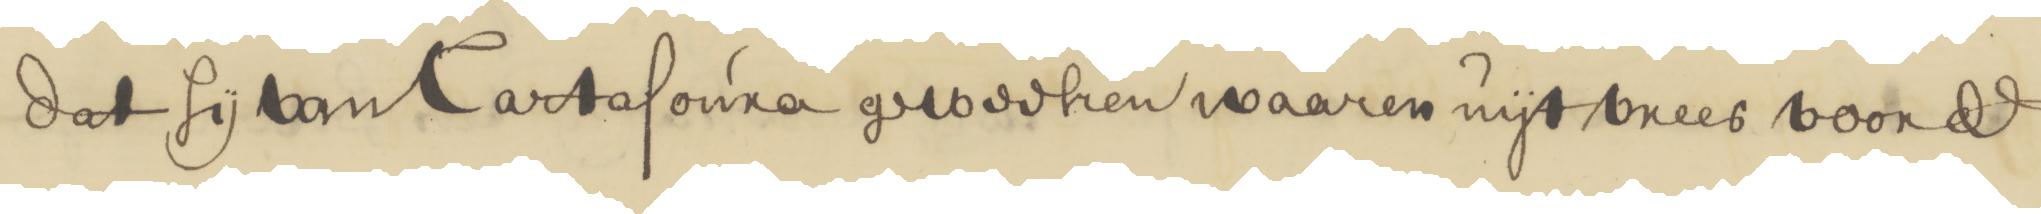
dat sij van Cartasoura geweeken waaren uijt vrees voor de
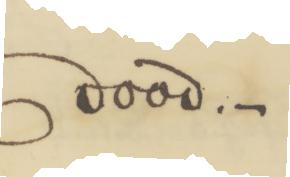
dood. -
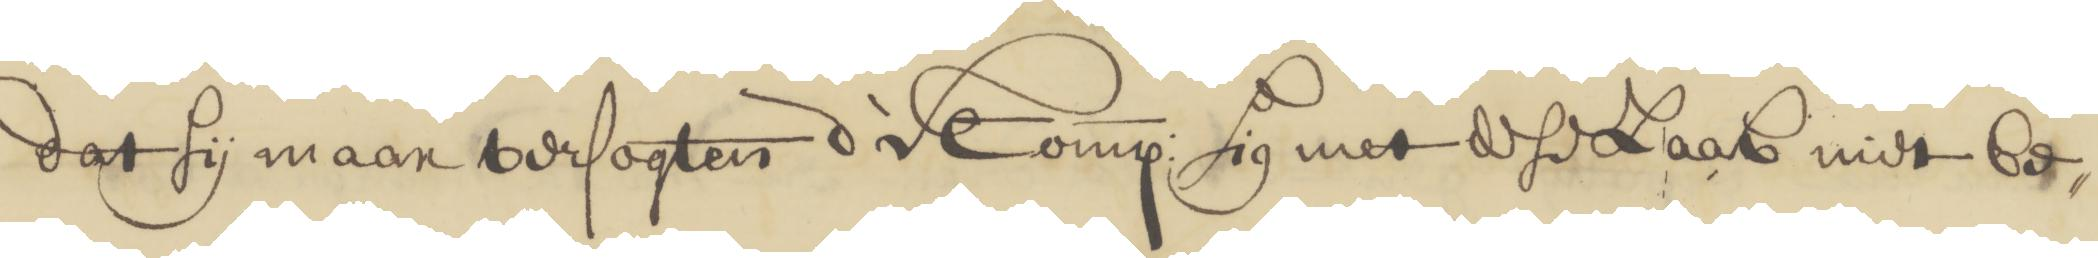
dat sij maar versogten d’ EComp: sig met dese zaak niet be„
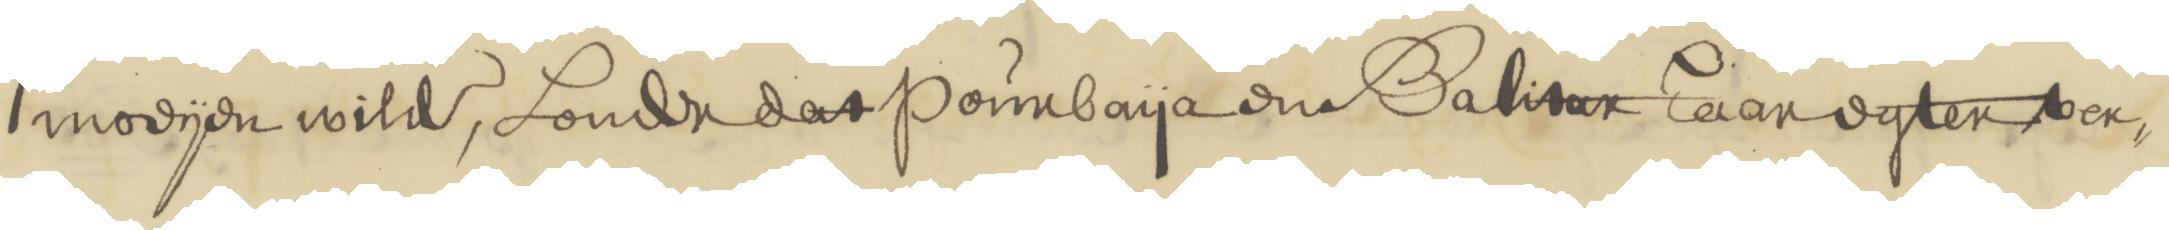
moeijen wilde, sonder dat Pourbaija en Balitar haar egter ver„
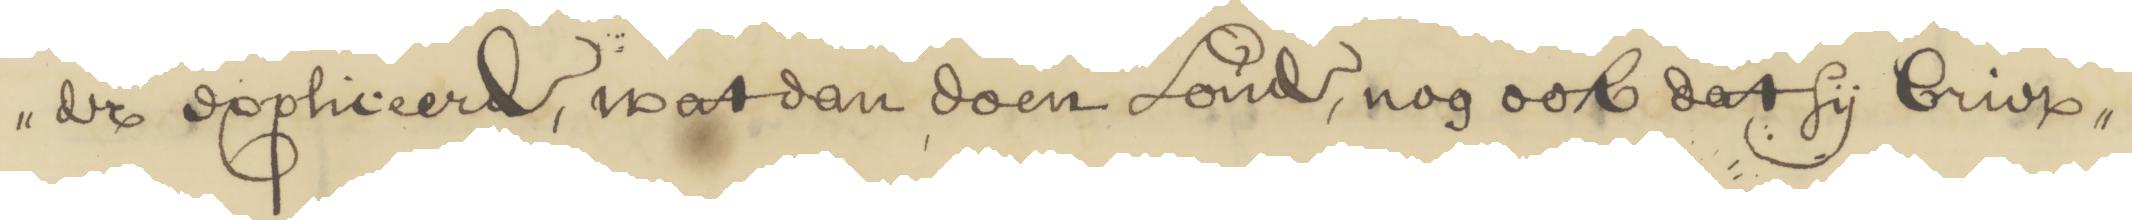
„der expliceerde, wat dan doen soude, nog ook dat sij briev„
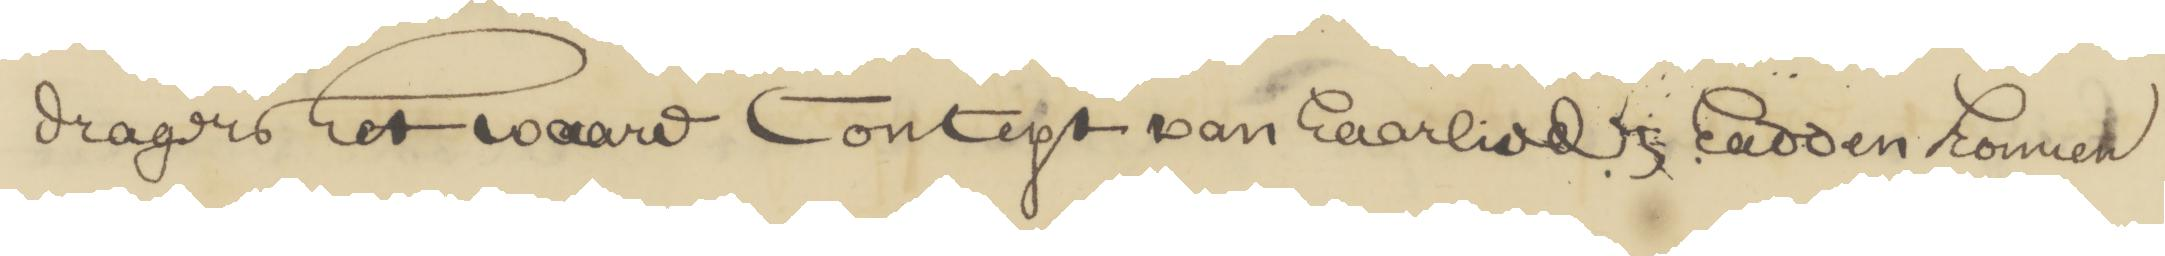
dragers het waare Concept van haarlieden hadden konnen
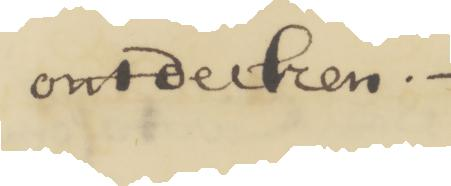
ontdecken.
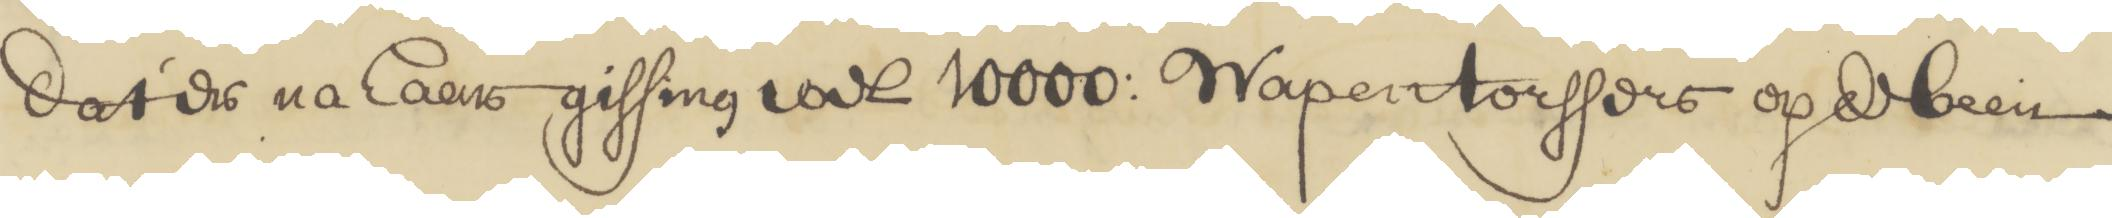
dat 'er na haar gissing wel 10000: Wapentorssers op de been
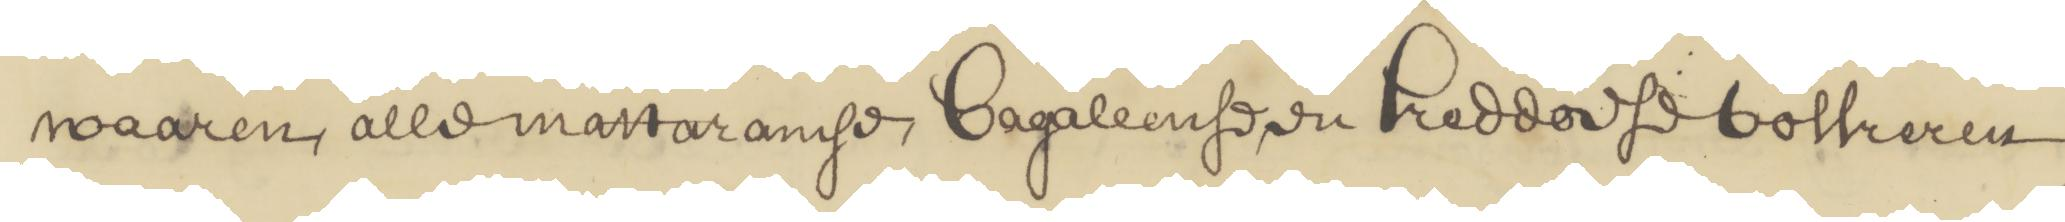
waaren, alle mattaramse, bagaleense, en keddoese volkeren
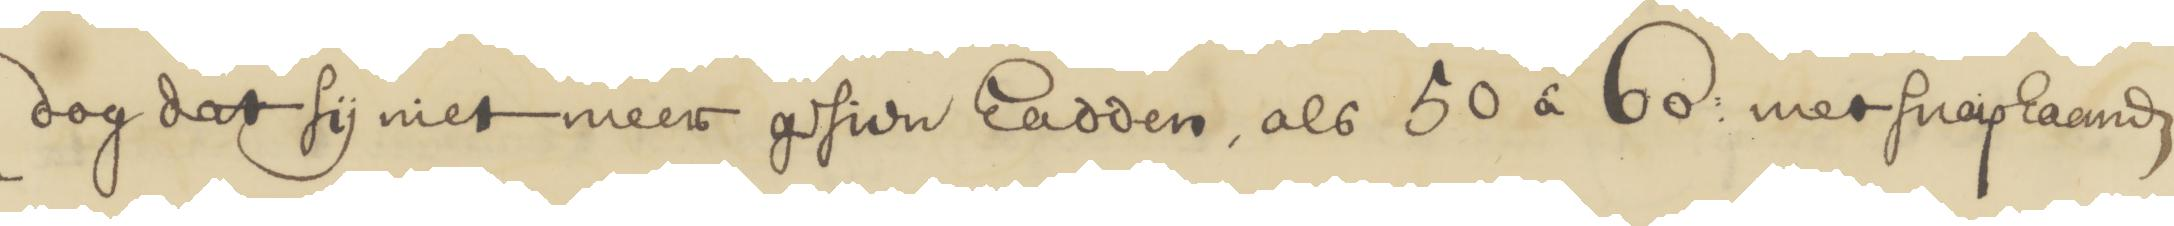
dog dat sij niet meer gesien hadden, als 50 â 60: met snaphaanen
